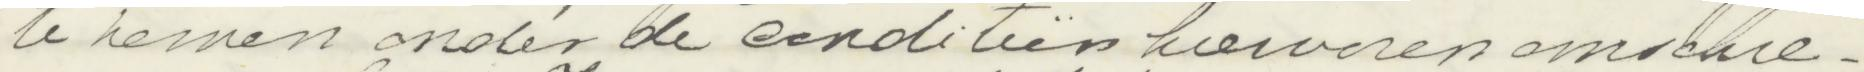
te nemen onder de conditiën hiervoren omschre-
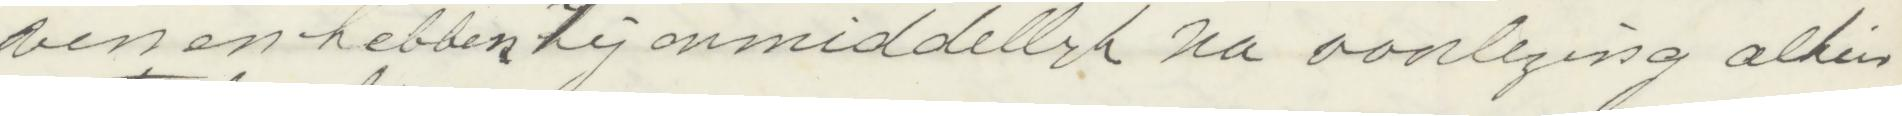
ven en hebben zij opmiddellyk na voorlezing alhier
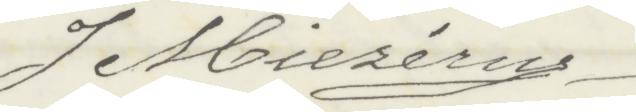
J Miezerus
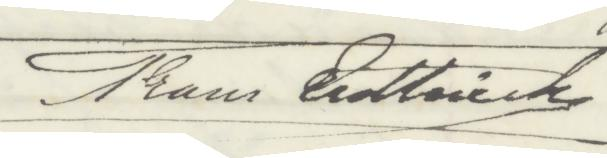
Frans Erdtsieck
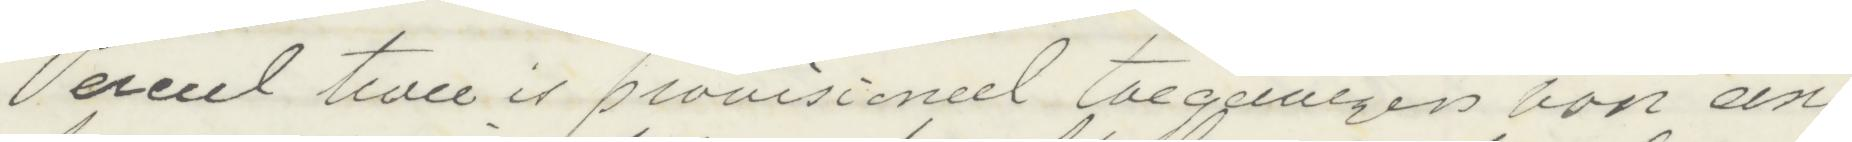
Perceel twee is provisioneel toegewezen voor een
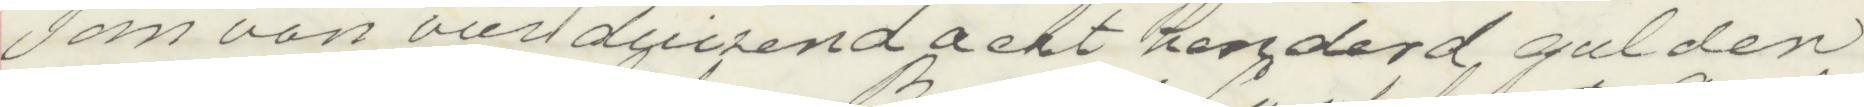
Som van vier duizend acht honderd gulden
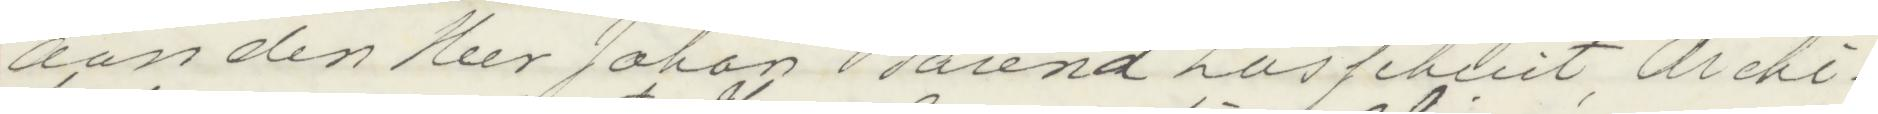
aan den Heer Johan Barend Lasschuit, Archi-
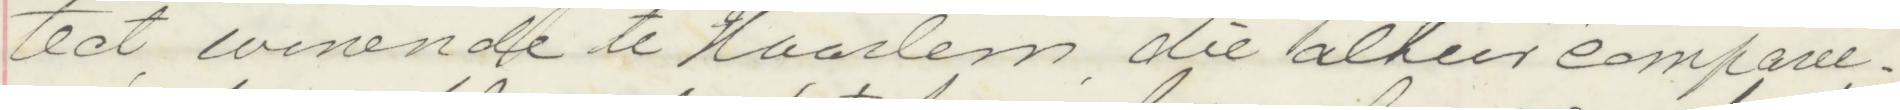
tect, wonende te Haarlem, die alhier comparee-
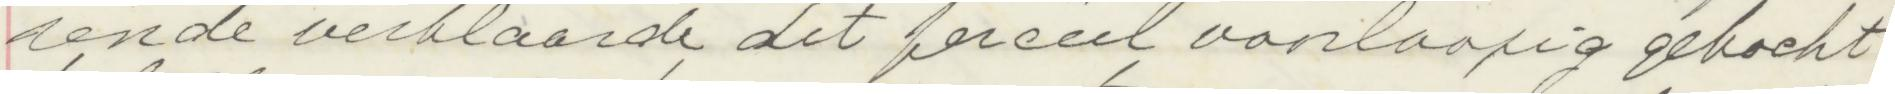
rende verklaarde dit perceel voorloopig gekocht
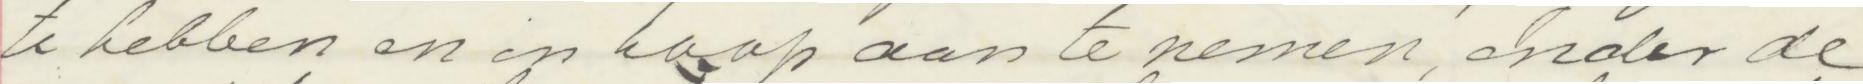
te hebben en in koop aan te nemen, onder de
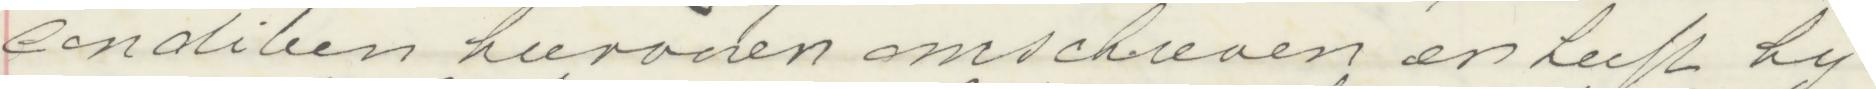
conditien hiervooren omschreven en heeft hij
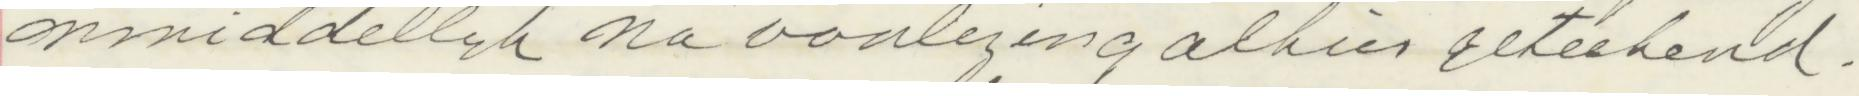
onmiddellyk na voorlezing alhier geteekend.
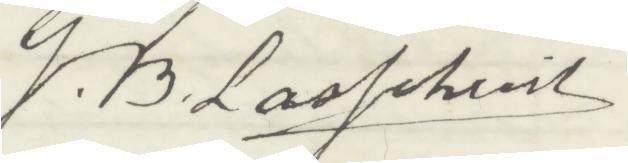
J. B: Lasschuit
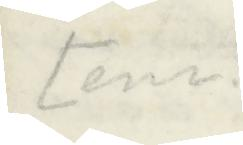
[enz
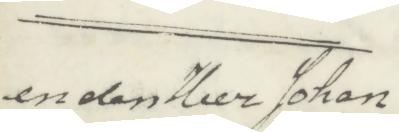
en den Heer Johan
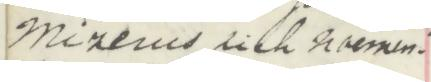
Mizerus zich noemen-
